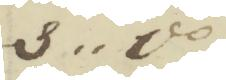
3 „ do
